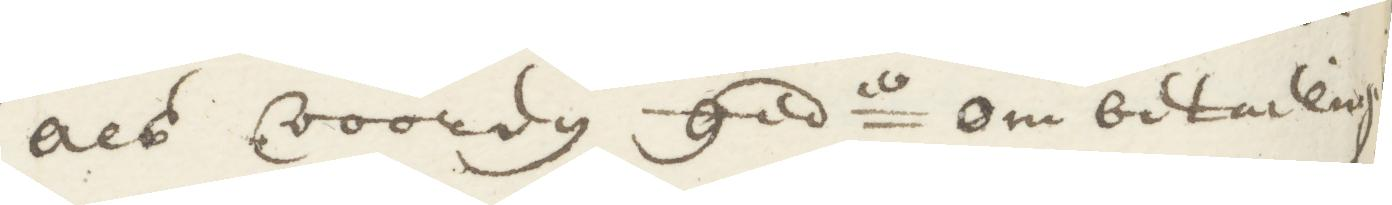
als vooren ged=e om betaeling
